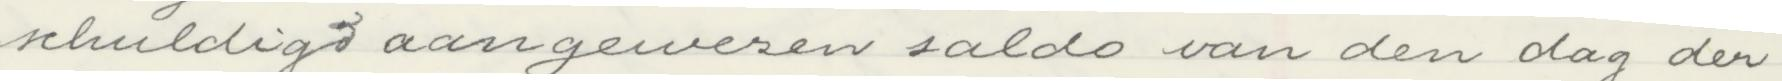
schuldigd aangewezen saldo van den dag der
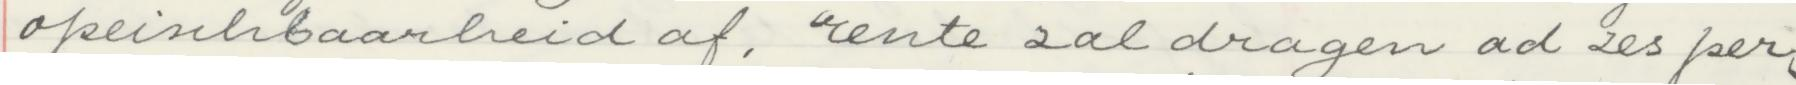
opeischbaarleid af, rente zal dragen ad zes per
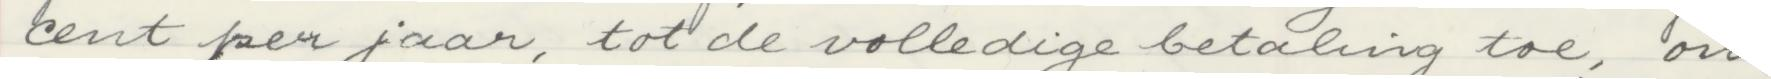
cent per jaar, tot de volledige betaling toe, on
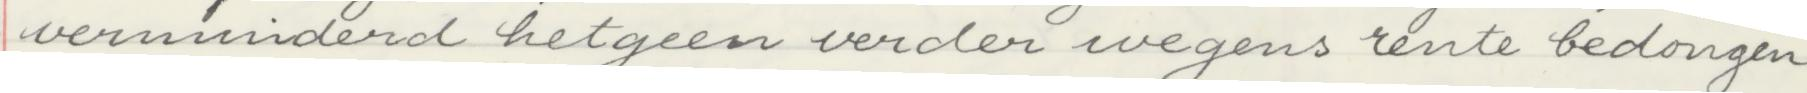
verminderd hetgeen verder wegens rente bedongen
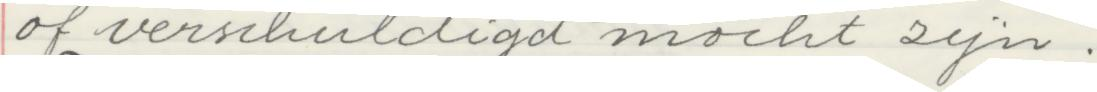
of verschuldigd mocht zijn
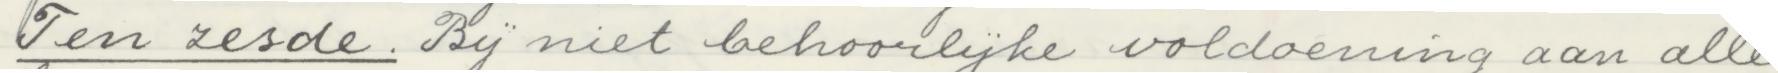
Ten zesde. Bij niet behoorlijke voldoening aan alle
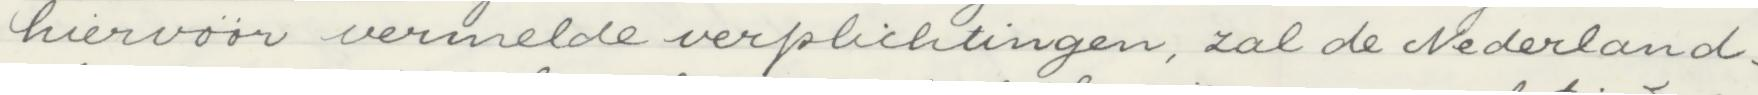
hiervóór vermelde verplichtingen, zal de Nederland
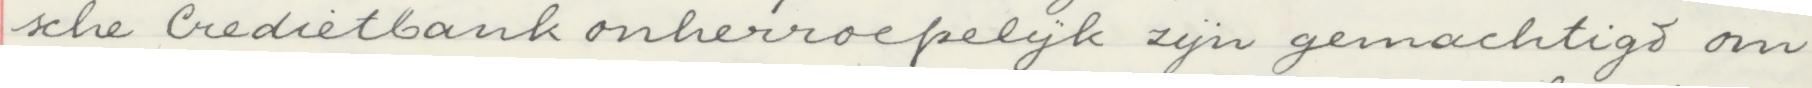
sche Credietbank onherroepelijk zijn gemachtigd om
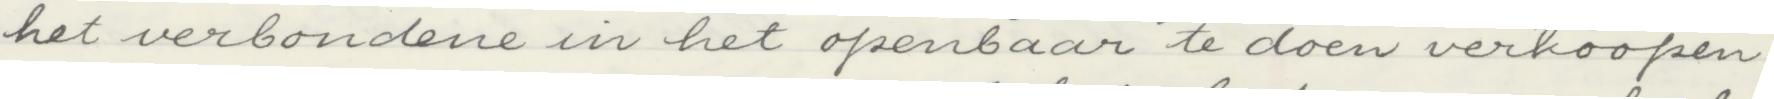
het verbondene in het openbaar te doen verkoopen
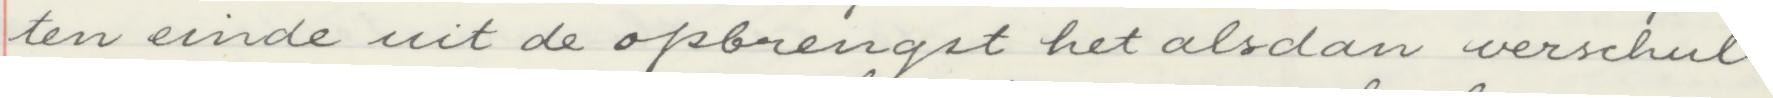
ten einde uit de opbrengst het alsdan verschul
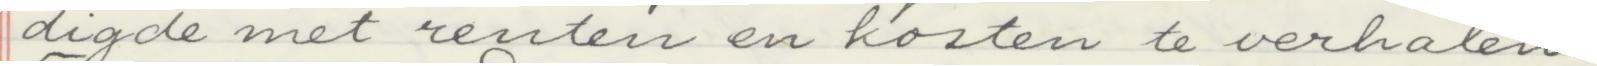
digde met renten en kosten te verhalen
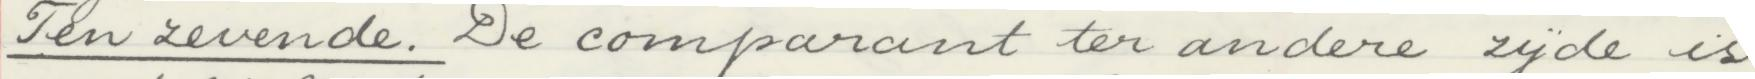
Ten zevende. De comparant ter andere zyde is
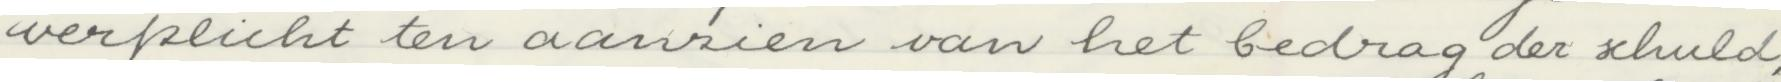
verplicht ten aanzien van het bedrag der schuld
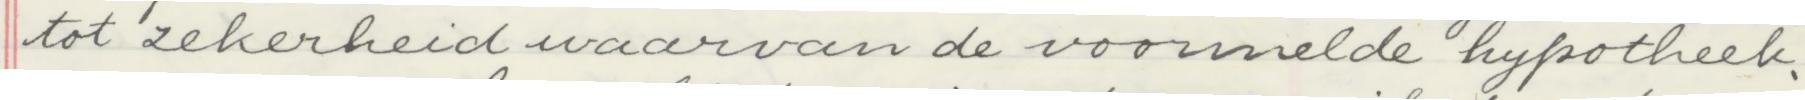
tot zekerheid waarvan de voormelde hypotheek
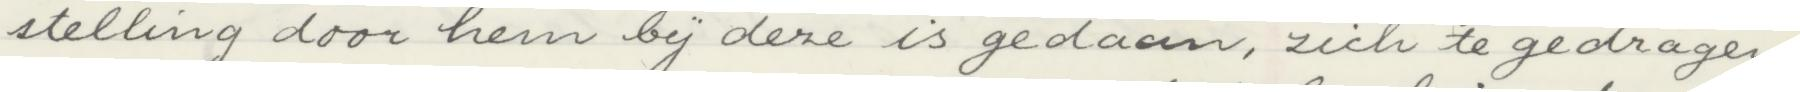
stelling door hem bij deze is gedaan, zich te gedragen
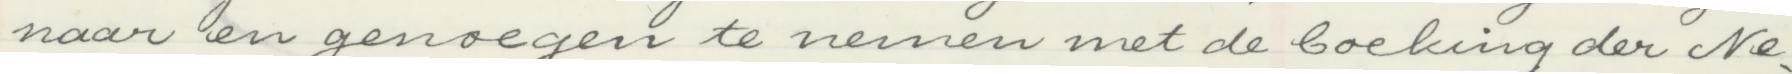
naar en genoegen te nemen met de boeking der Ne
